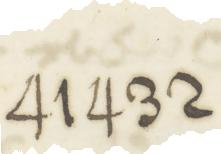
41432
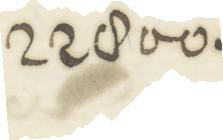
22800.
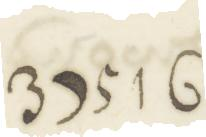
37516.
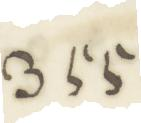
355.
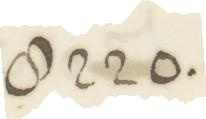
8220.
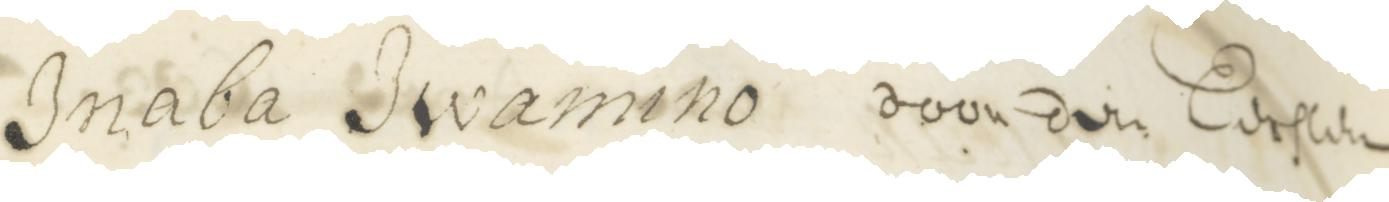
Inaba Iwamino door den Eersten
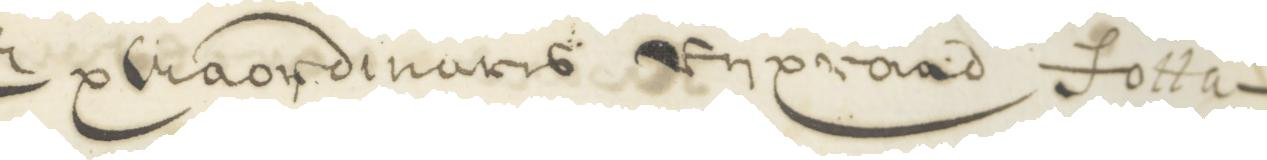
Extraordinairs rijxraad Jotta
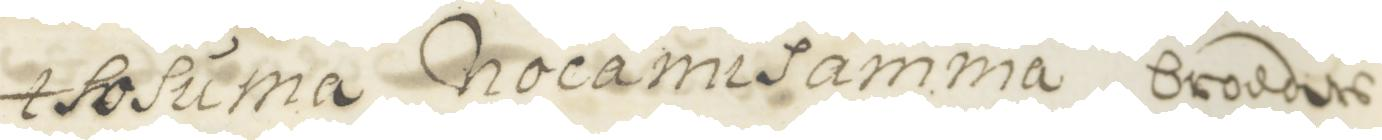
thosuma Nocamisamma, broeders
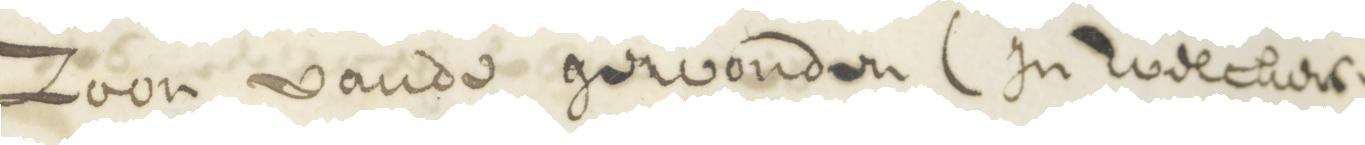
zoon vande gewonden (in welckers
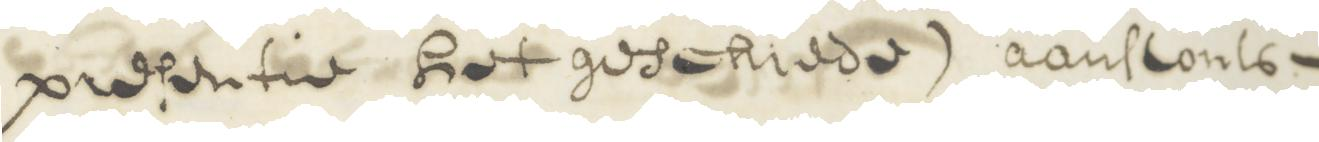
presentie het geschiede) aanstonts
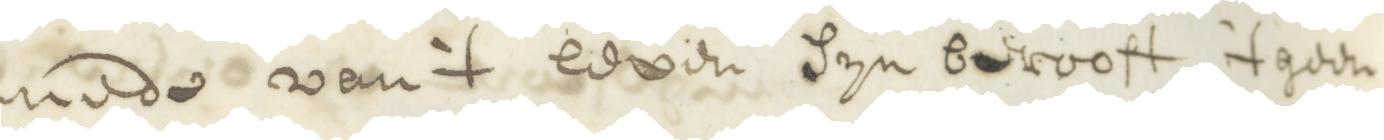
mede van ’t leven sijn berooft, ’t geen
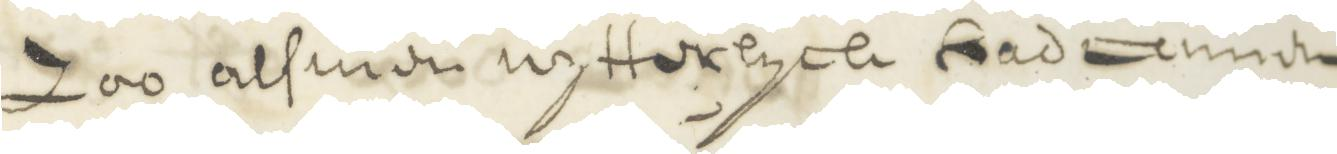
zoo als men uytterlyck had connen
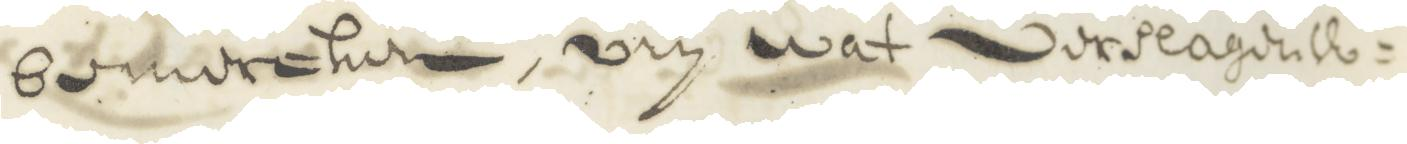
bemercken, vrij wat verslagenth=t
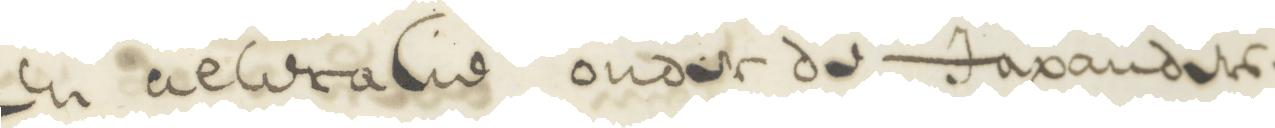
En alteratie onder de Japanders
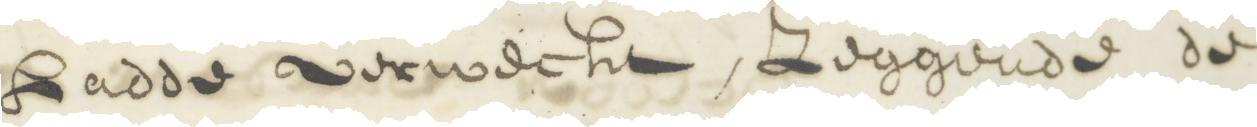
hadde verweckt, zeggende de
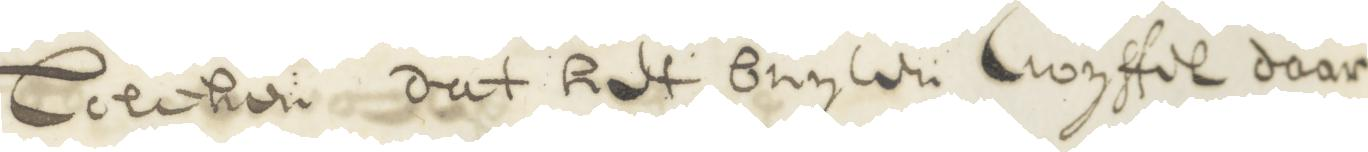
Tolcken dat het buyten twyffel daar
